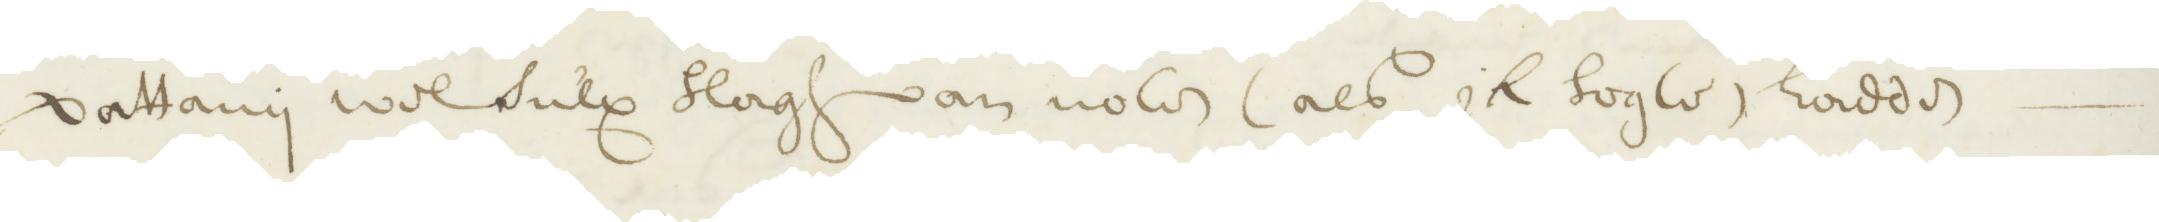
pattanij wel sulx slagh van noten (als jk sogte) hadden —
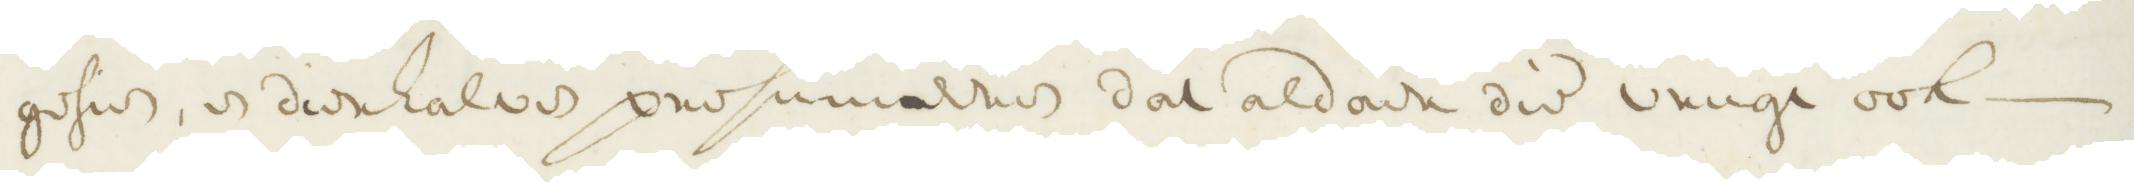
gesien, en dierhalven presumeeren dat aldaer die vrugt ook —
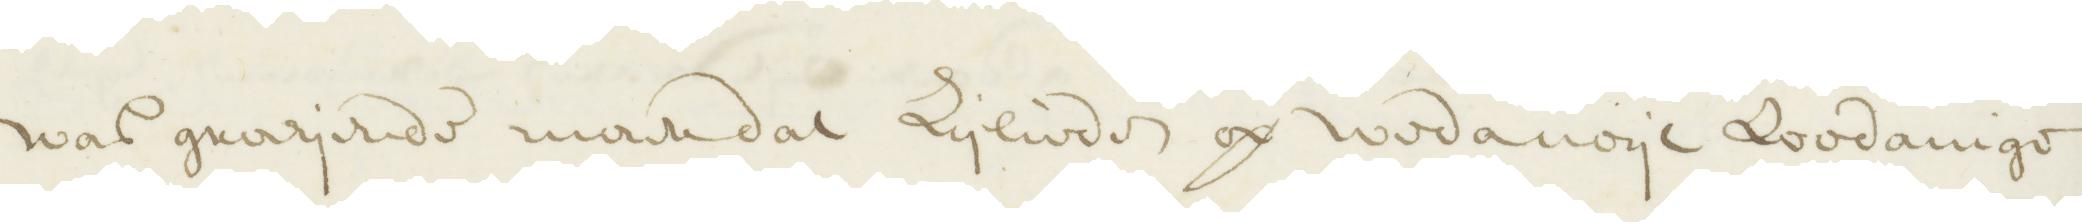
was groeijende maer dat zijlieden op weda noijt zoodanige
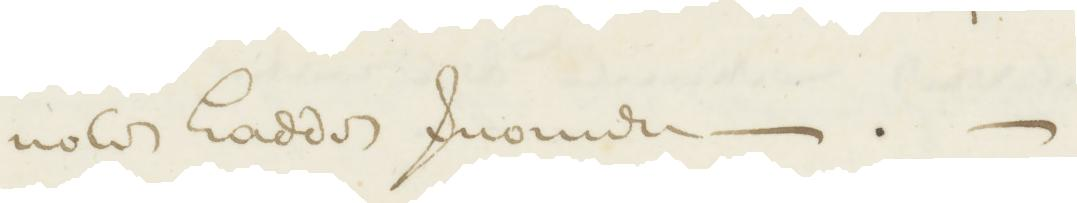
noten hadden vernomen— . —
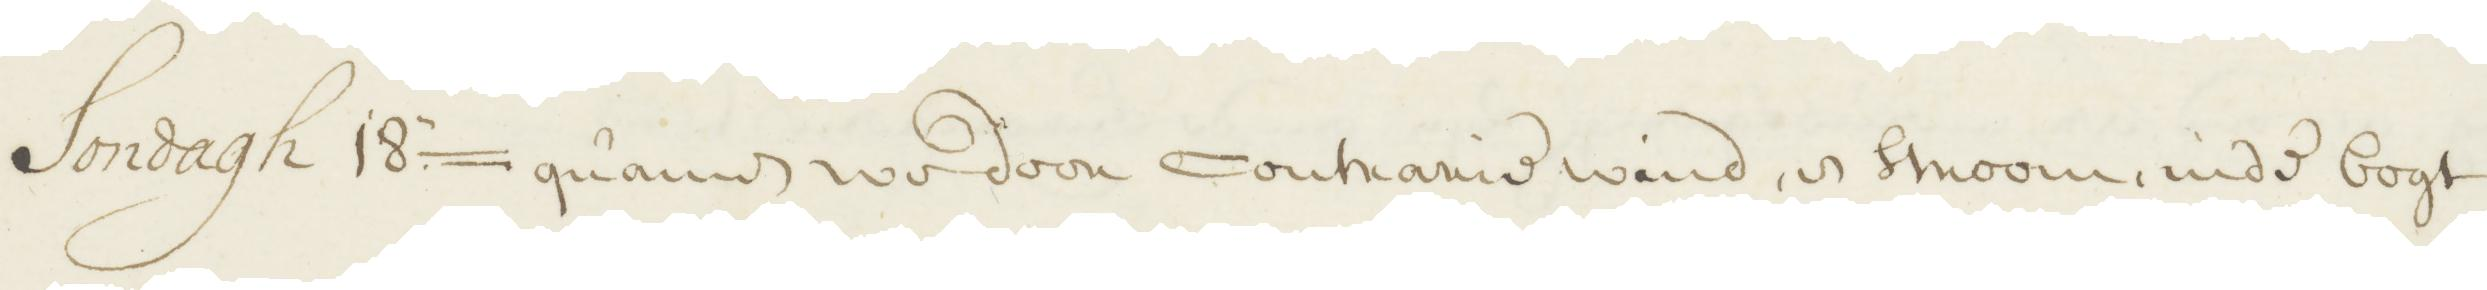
Sondagh 18.=' quamen we door contrarie wind, en stroom, inde bogt
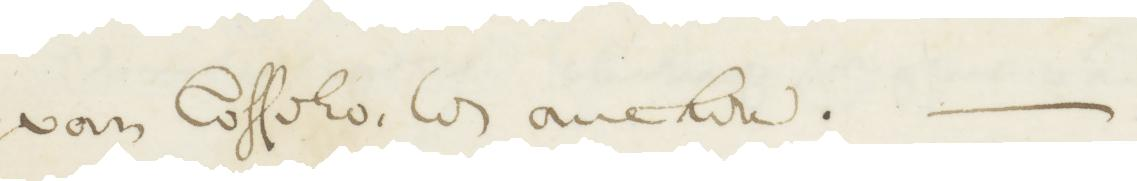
van Tosseho, ten ancker. —
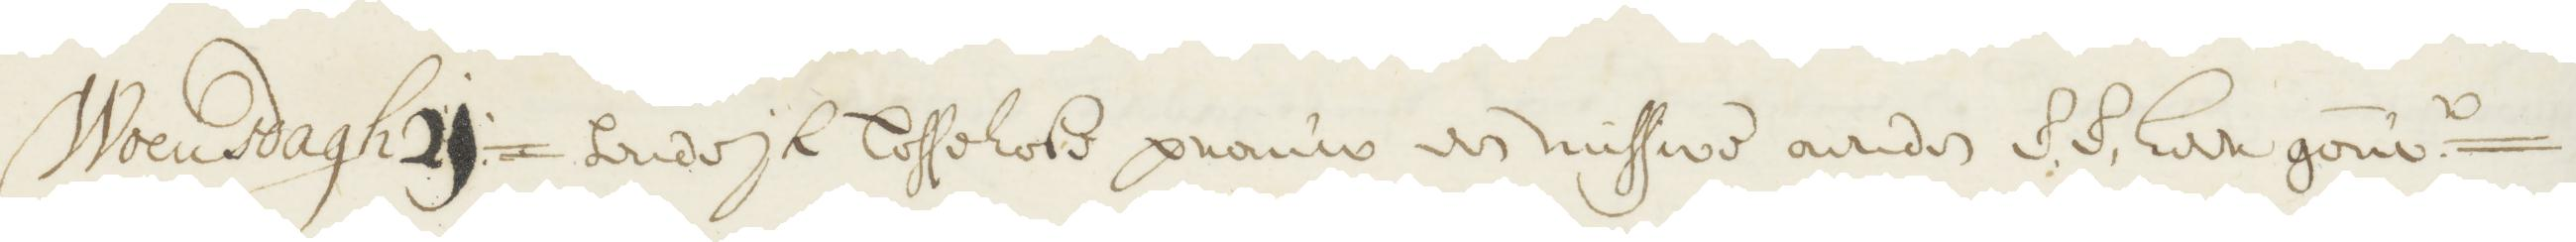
Woensdagh 21=' sende jk Tossehose prauw een missive aenden E. E, heer gouv.=r
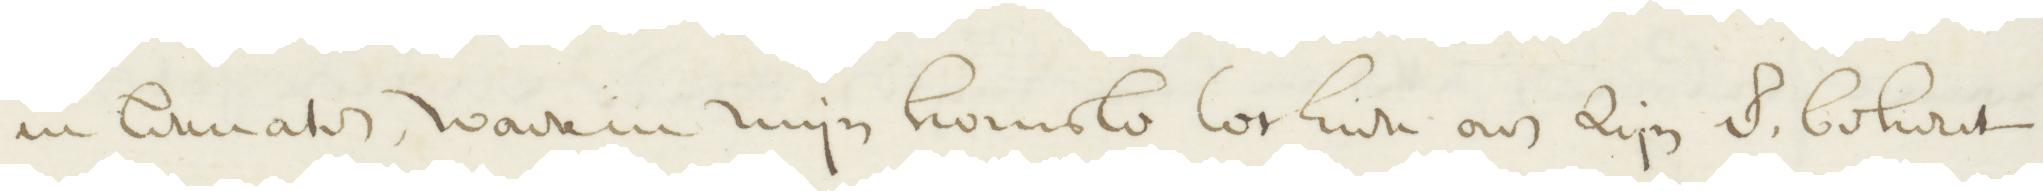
in Ternaten, waerin mijn komste tot hier aen zijn E. bekent
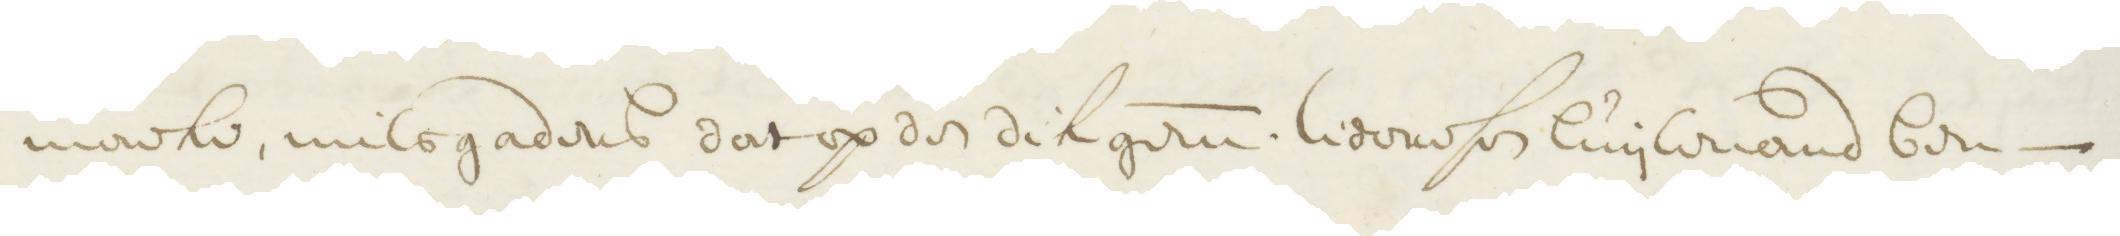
maeke, mitsgaders dat op den dik gem: tidoresen luijtenand ben —
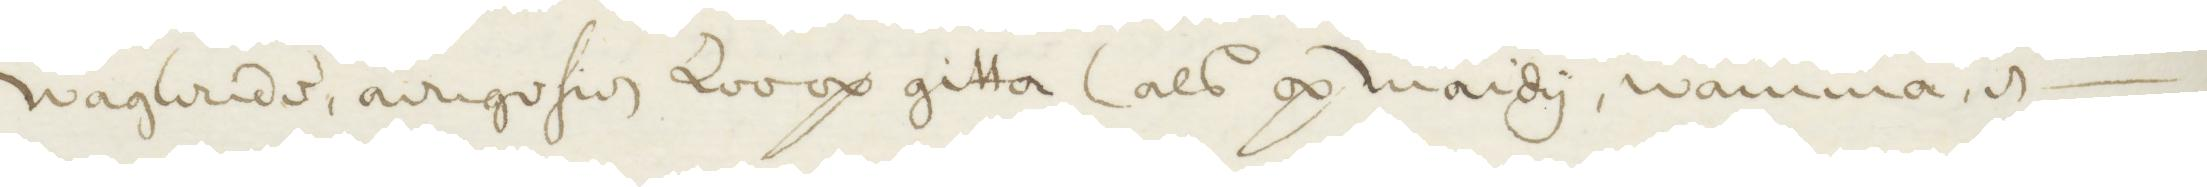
wagtende, aengesien zoo op gitta (als op maidij, wamma, en —
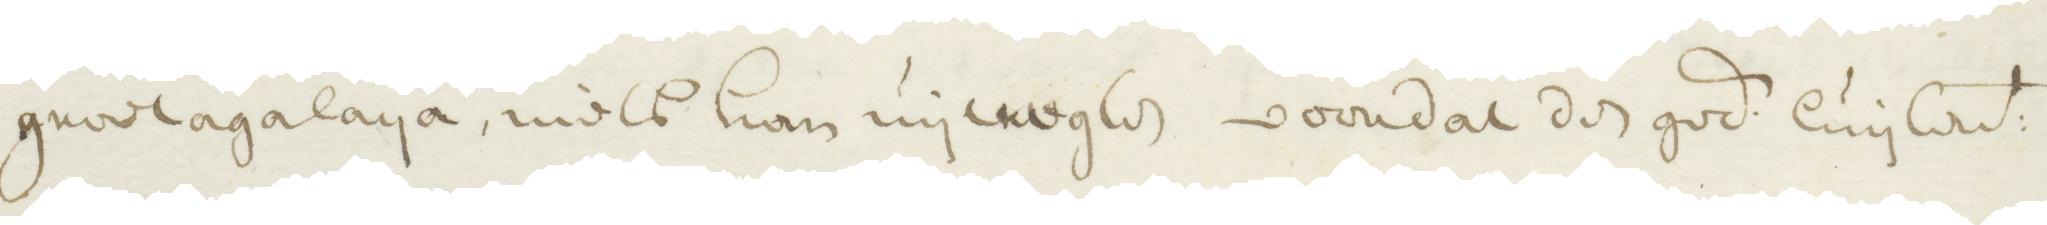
groetagalaija, niets kan uijtregten voor dat den ged. luijten:t
